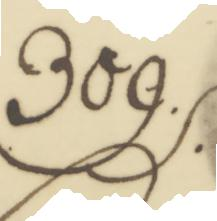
309.
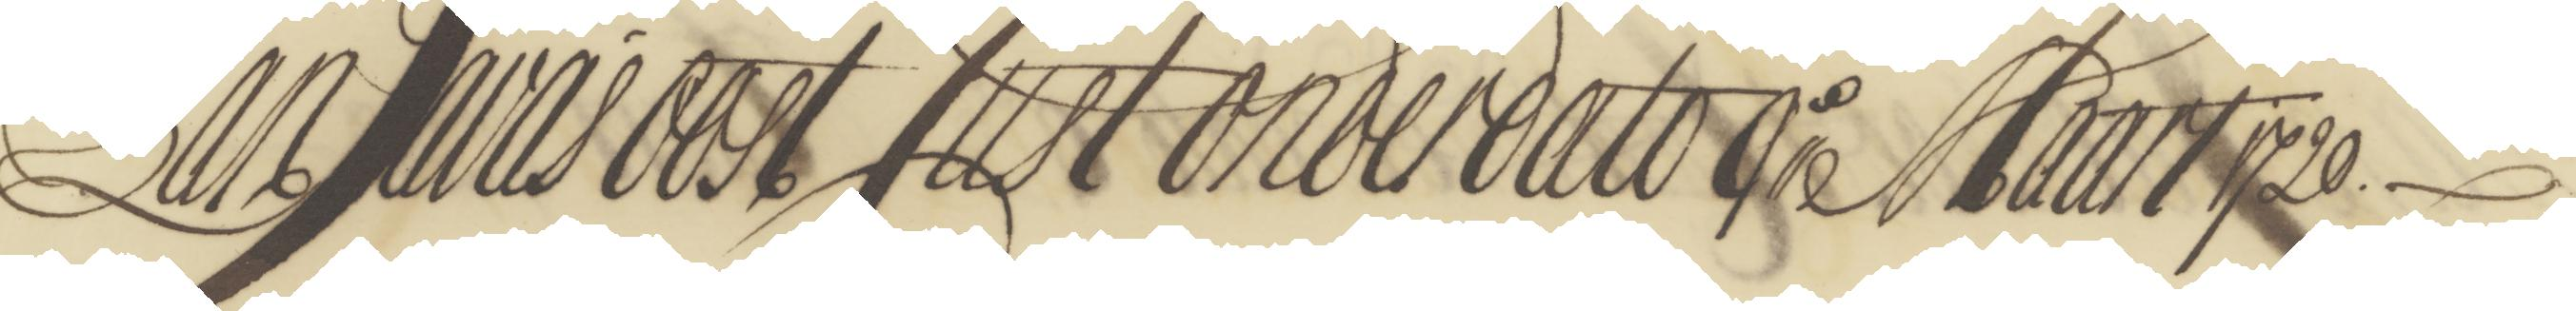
Van Java's oost Cust onder dato 4„e Maart 1720. —
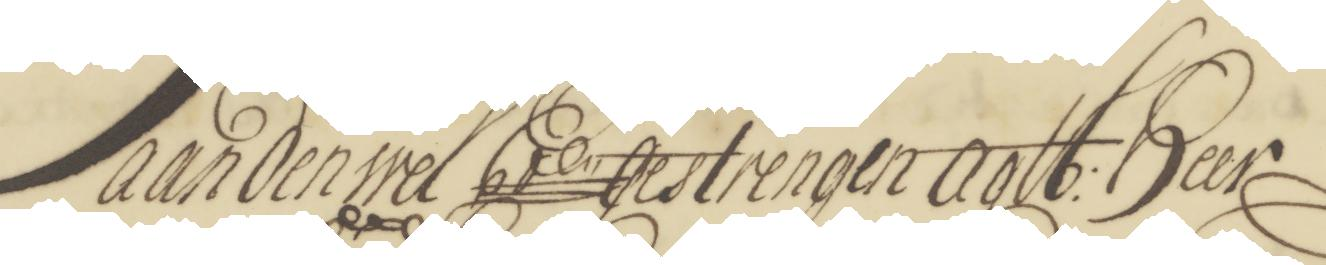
aan den wel Ed=le gestrengen agtb: Heer
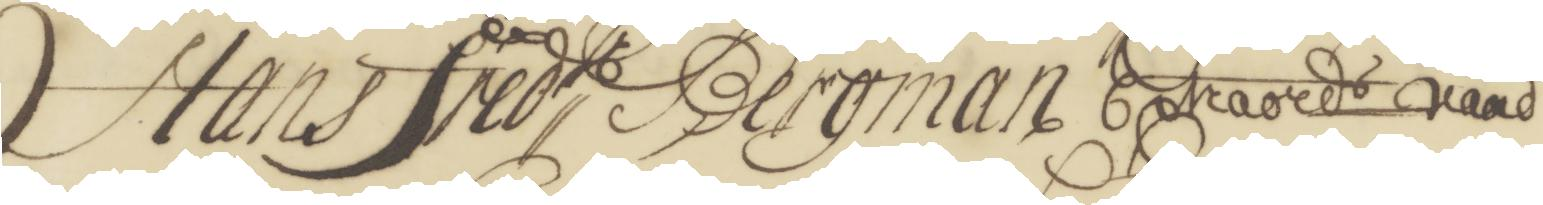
Hans Fred„k Bergman Extraord=s raad
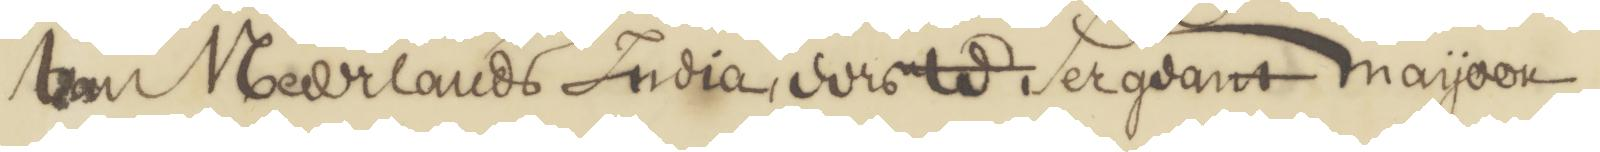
van Nederlands India, eerste sergeant maijoor
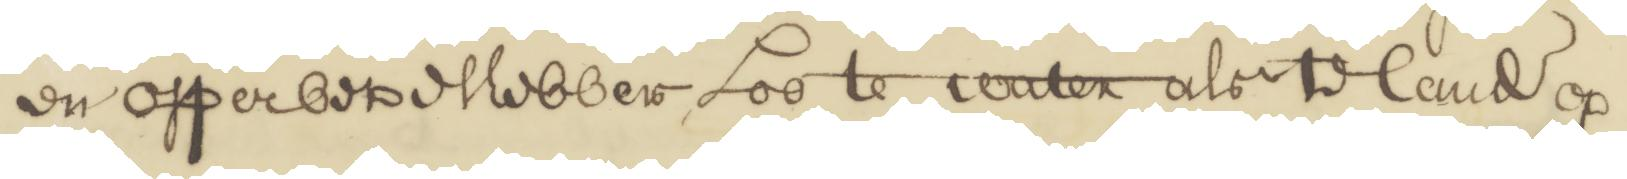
en opperbevelhebber, soo te water als te lande op
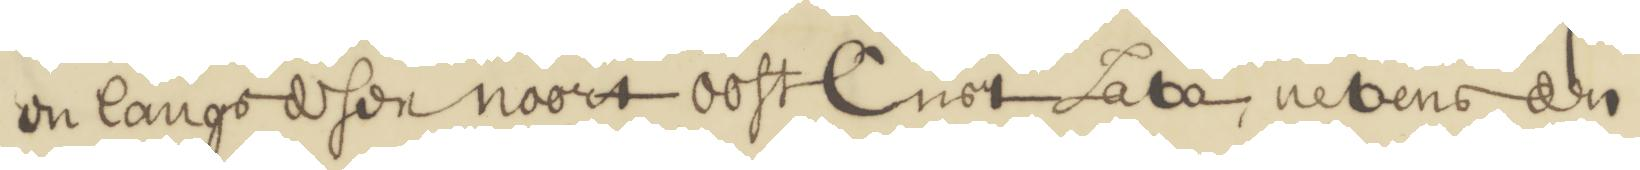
en langs deser noort oost Cust Java, nevens den
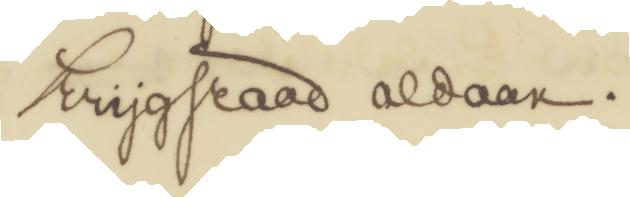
krijgsraad aldaar.
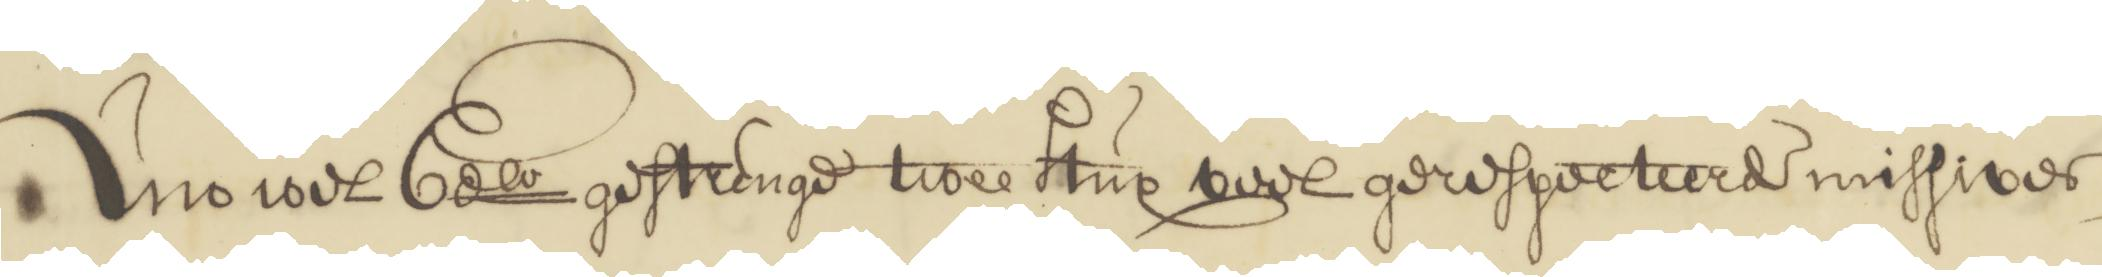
Uw wel Ed=le gestrenge twee stux veel gerespecteerde missives
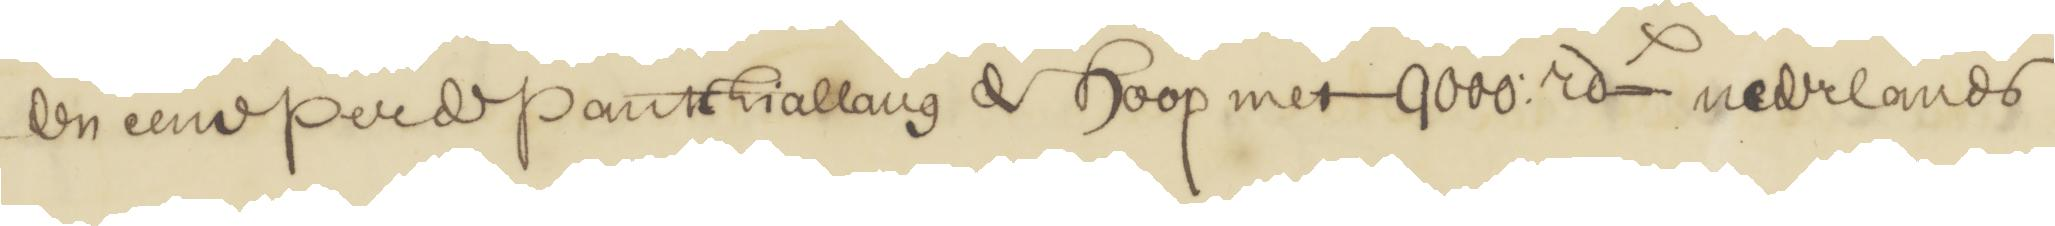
den eene per de pantchiallang de Hoop met 4000: rd=s nederlands
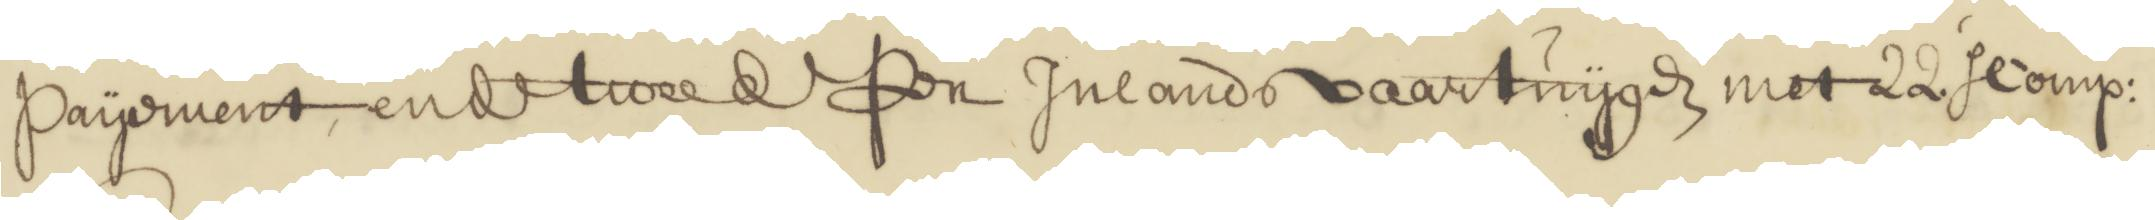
paijement, ende tweede per Jnlands vaartuijgen met 22. 'sComp:s
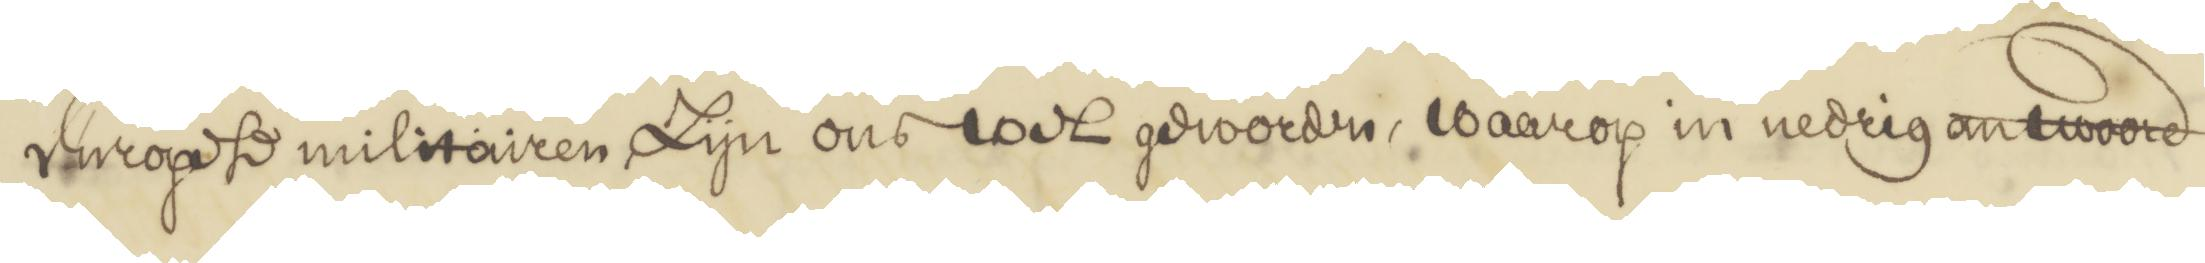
Europese militairen, zijn ons wel geworden, waarop in nedrig antwoord
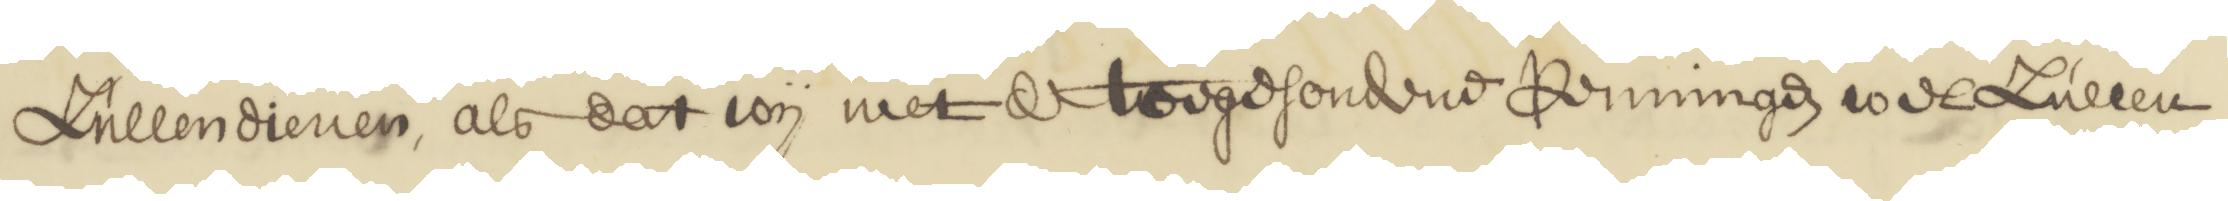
zullen dienen, als dat wij met de toegesondene penningen wel zullen
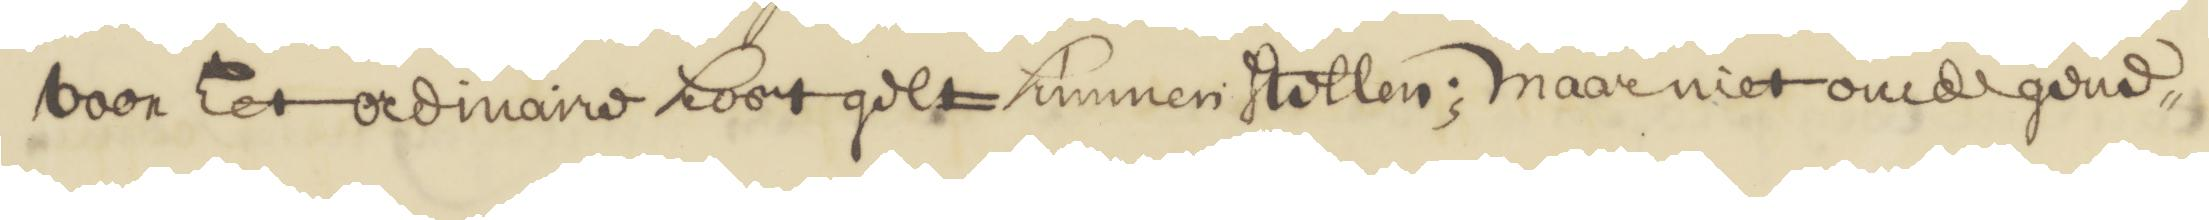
voor het ordinaire kost gelt kunnen stellen; maar niet om de gene„
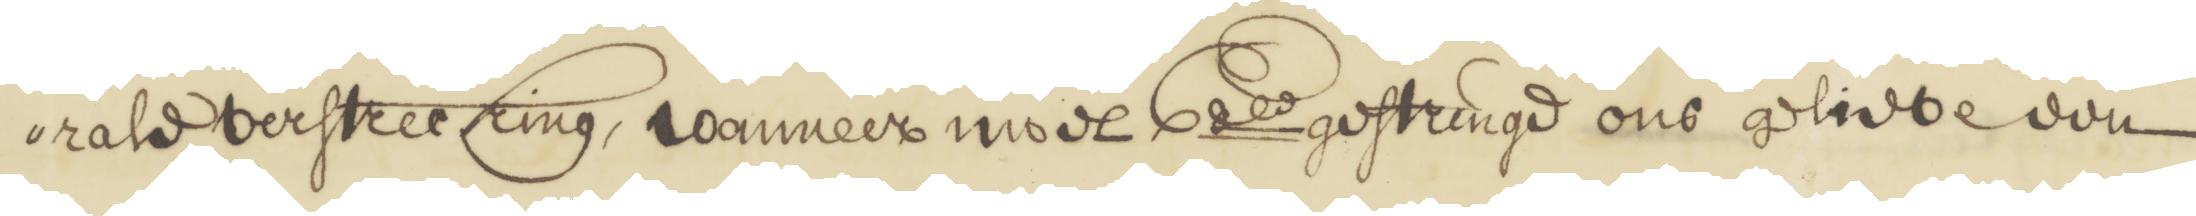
„rale verstrecking, wanneer uwel Ed=le gestrenge ons gelieve een
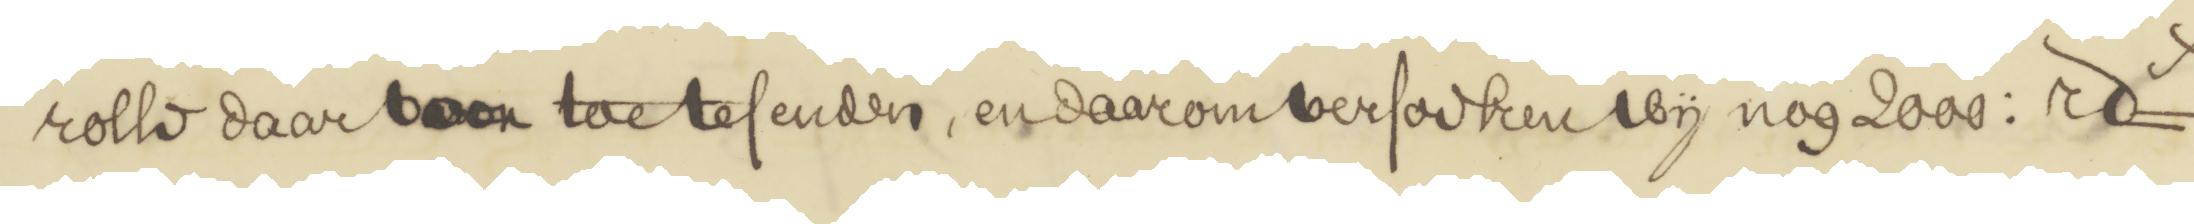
rolle daar voor toe te senden, en daarom versoeken wij nog 2000: rd=s
